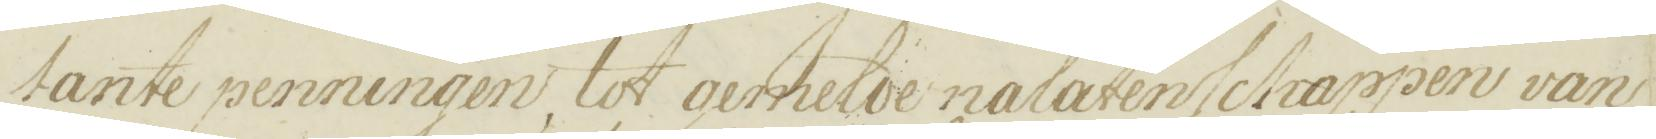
tante penningen, tot gemelde nalatenschappen van
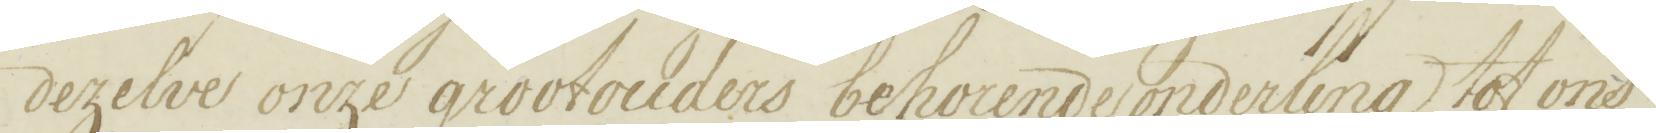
dezelve onze grootouders behorende onderling, tot ons
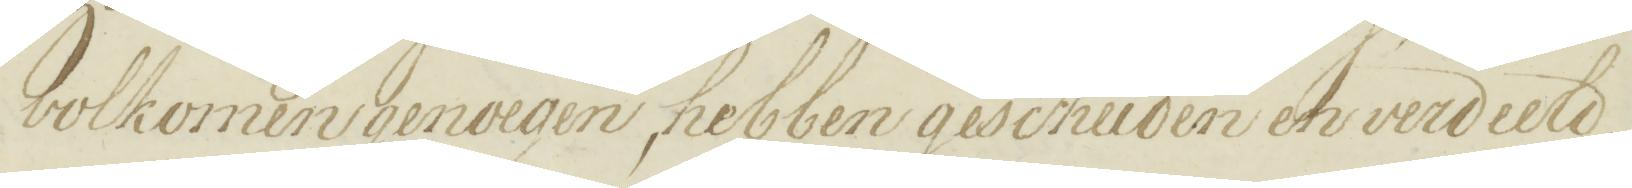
volkomen genoegen, hebben gescheiden en verdeeld,
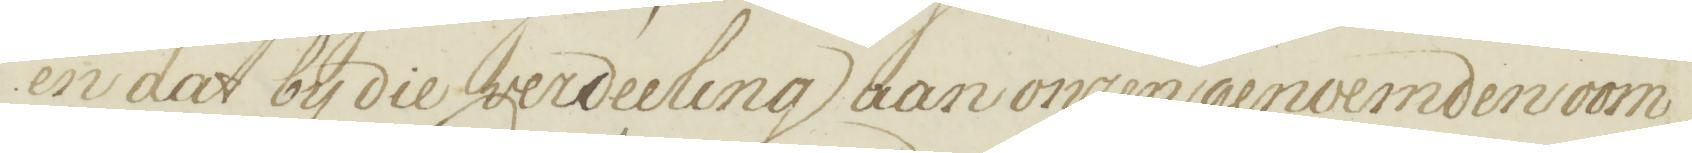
en dat by die verdeeling aan onzen genoemden oom,
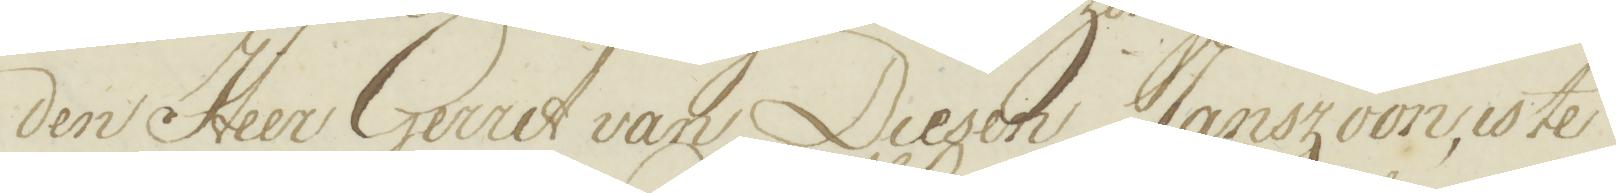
den Heer Gerrit van Diesen Janszoon, is te
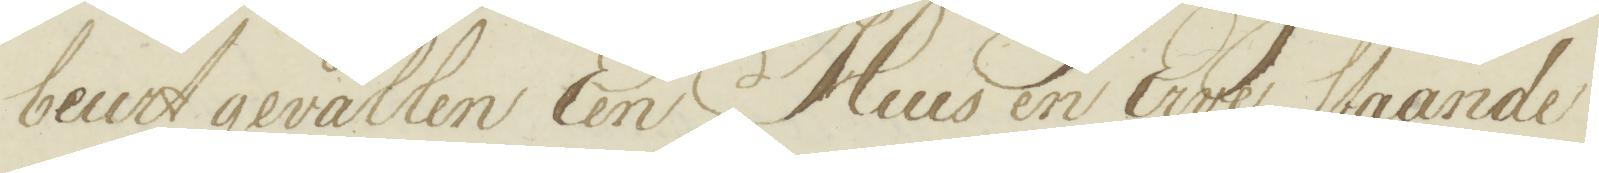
beurt gevallen Een Huis en Erve staande
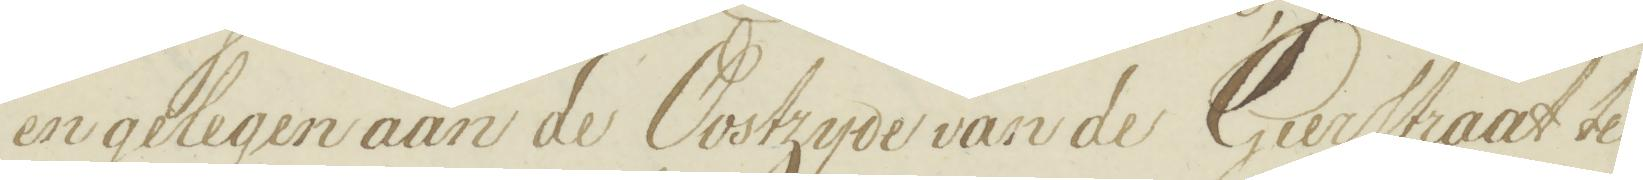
en gelegen aan de Oostzyde van de Gierstraat te
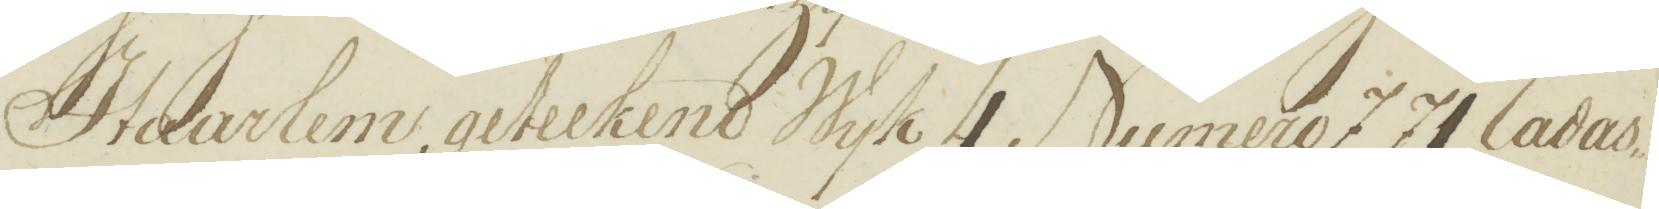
Haarlem, geteekend Wyk 4 Numero 771, Cadas„
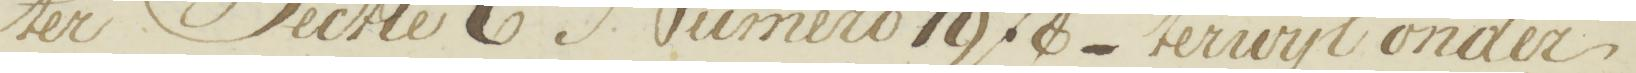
ter Sectte C Numero 1978 - terwyl onder
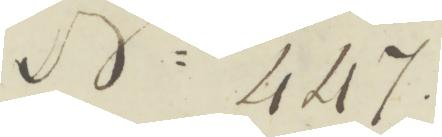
N=o 447.
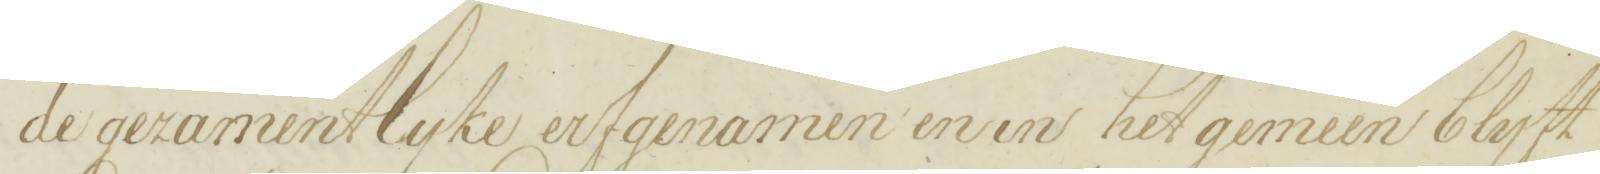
de gezamentlyke erfgenamen en in het gemeen blyft
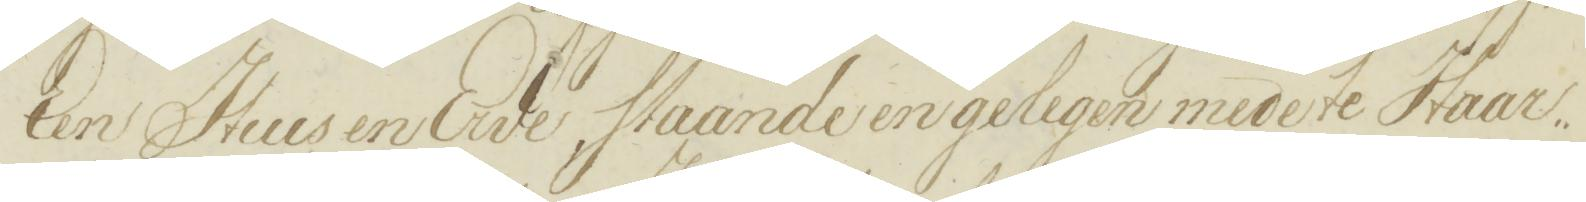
Een Huis en Erve, staande en gelegen mede te Haar„
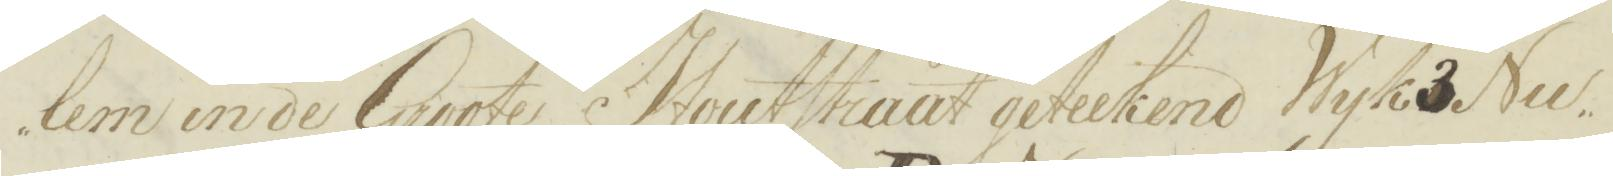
„lem in de Groote Houtstraat geteekend Wyk 3 Nu„
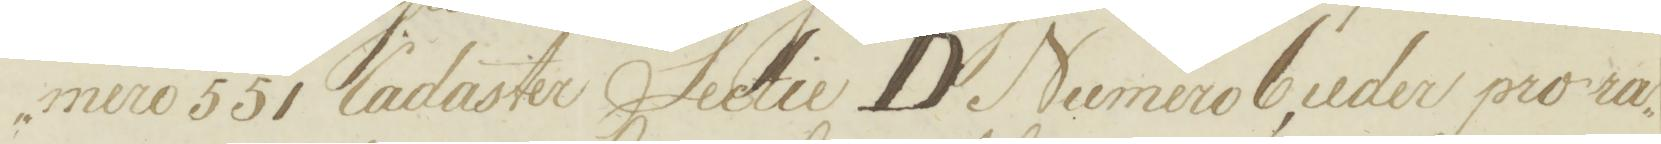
„mero 551 Cadaster Sectie D Numero 6, ieder pro ra„
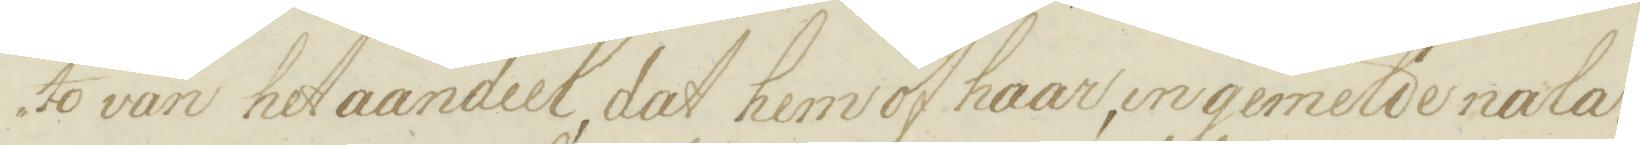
„to van het aandeel dat hem of haar, in gemelde nala
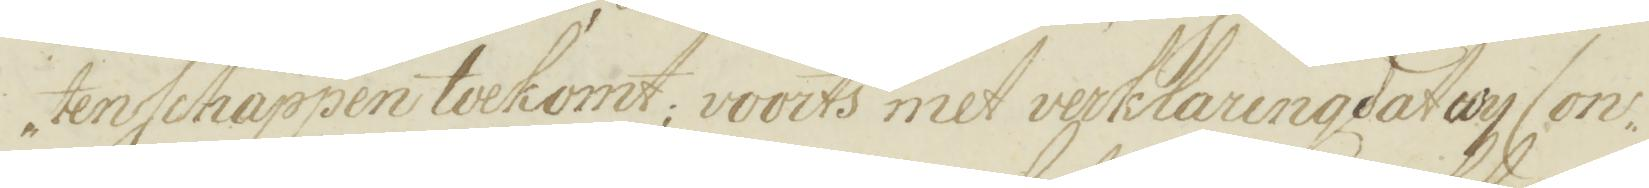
„tenschappen toekomt; voorts met verklaring dat wy (on„
